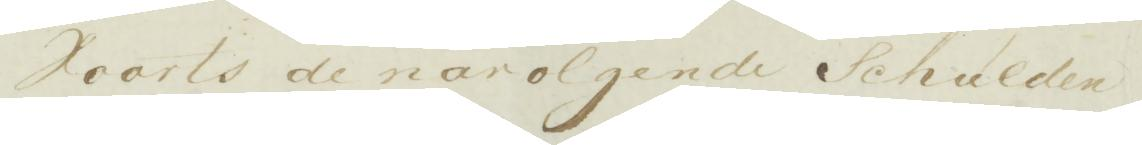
Voorts de navolgende Schulden
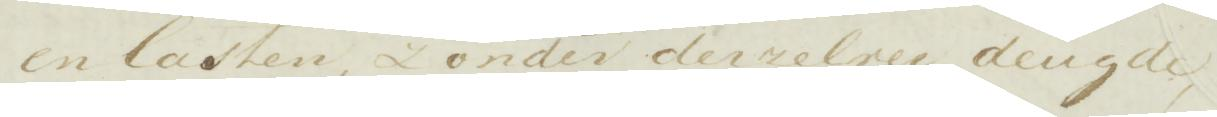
en lasten, zonder derzelve deugde,
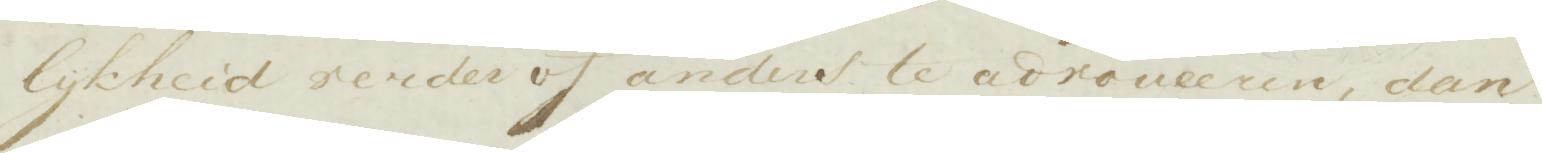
lijkheid verder of anders te advoueeren, dan
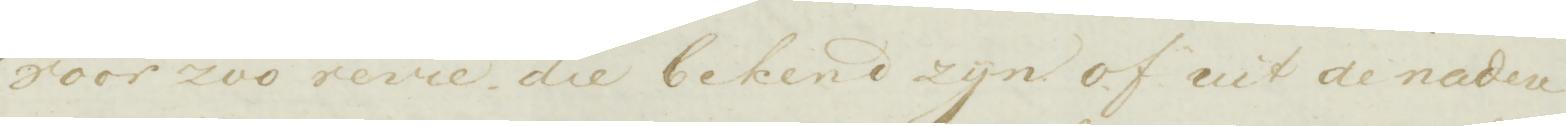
voor zoo verre, die bekend zijn of uit de nader
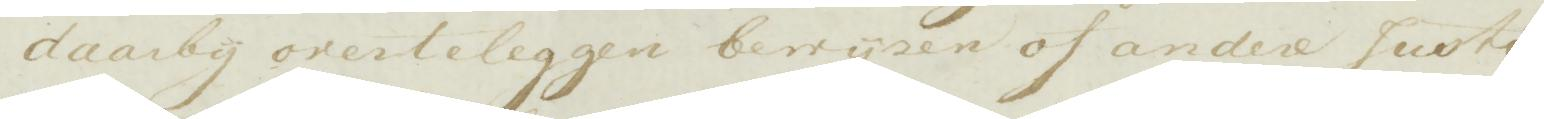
daarbij overteleggen bewijzen of ander Justi
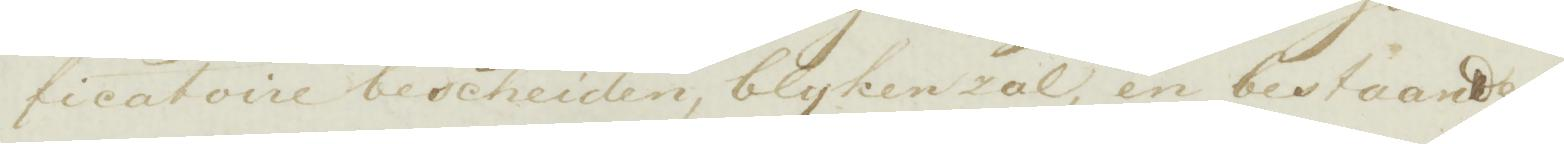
ficatoire bescheiden, blijken zal, en bestaande
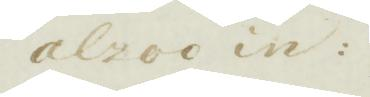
alzoo in:
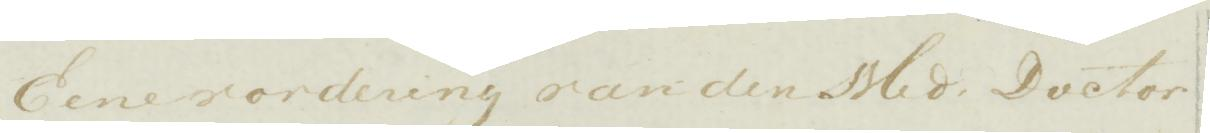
Eene vordering van den Med. Doctor
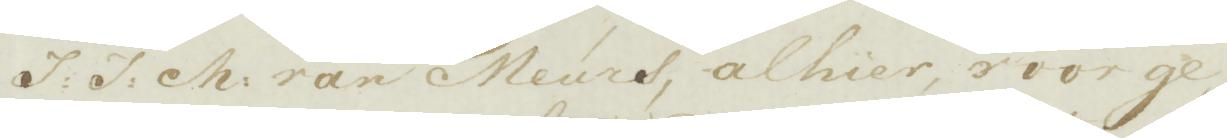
J: J: Ch: van Meurs, alhier, voor ge„
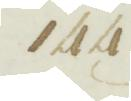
ƒ 144 95
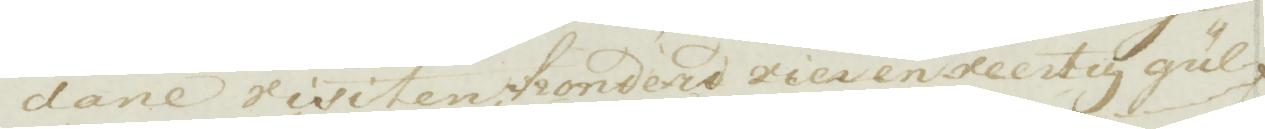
dane visiten, honderd vier en veertig gul
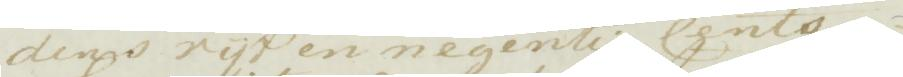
dens vijf en negentig Cents
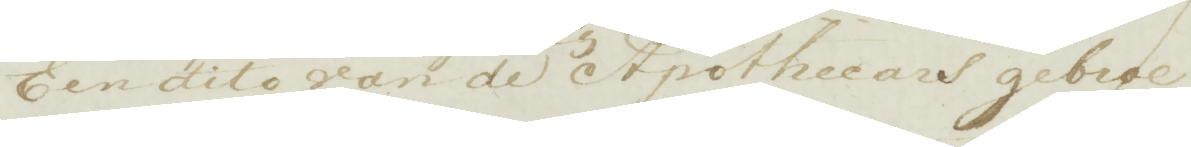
Een dito van de Apothecars gebroe
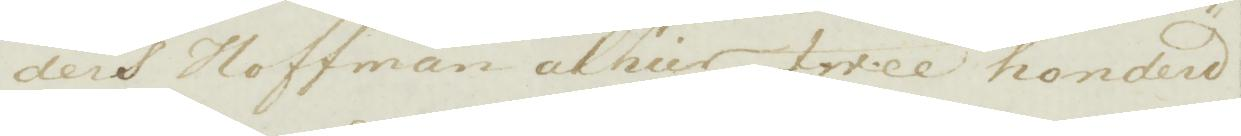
ders Hoffman alhier, twee honderd
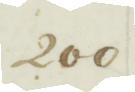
200 —
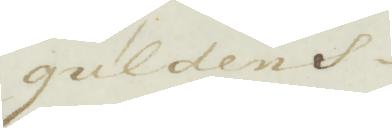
guldens - - - - - - - - - - - - - -
